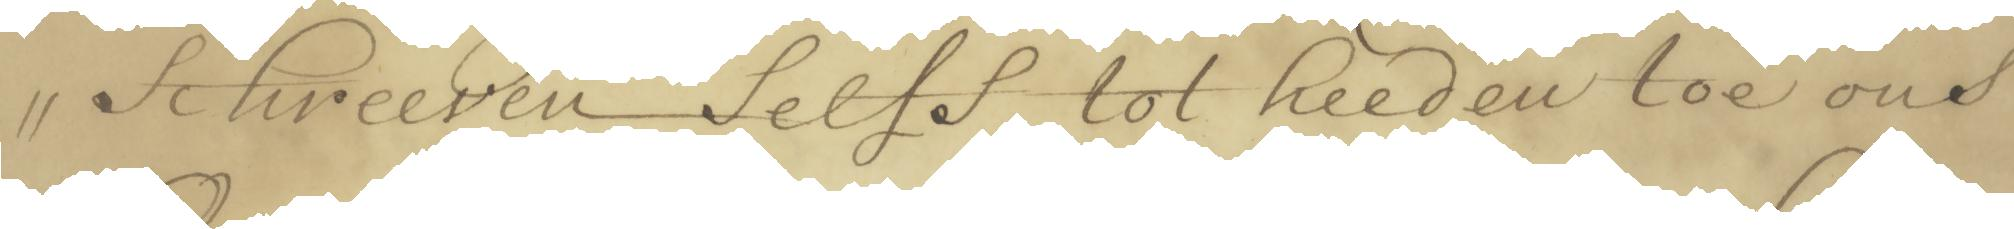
„schreeven selfs tot heeden toe ons
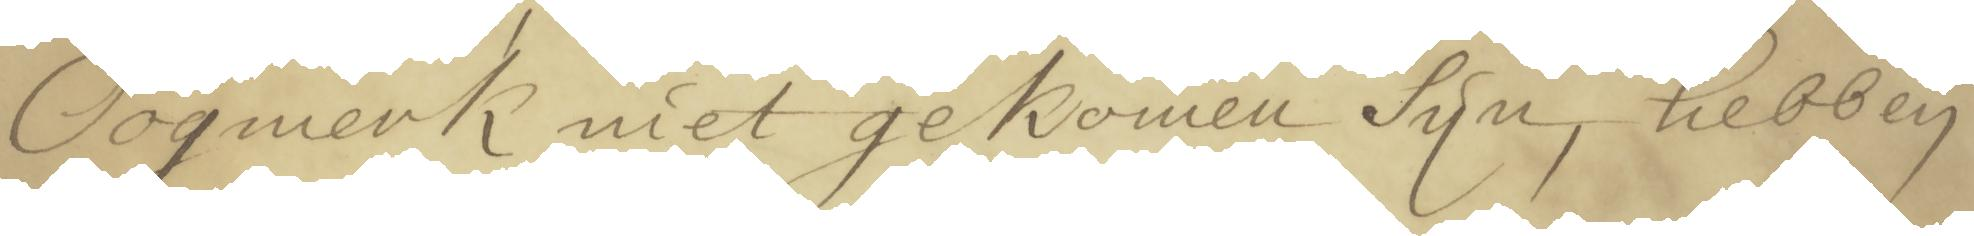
Oogmerk niet gekomen sijn, hebben
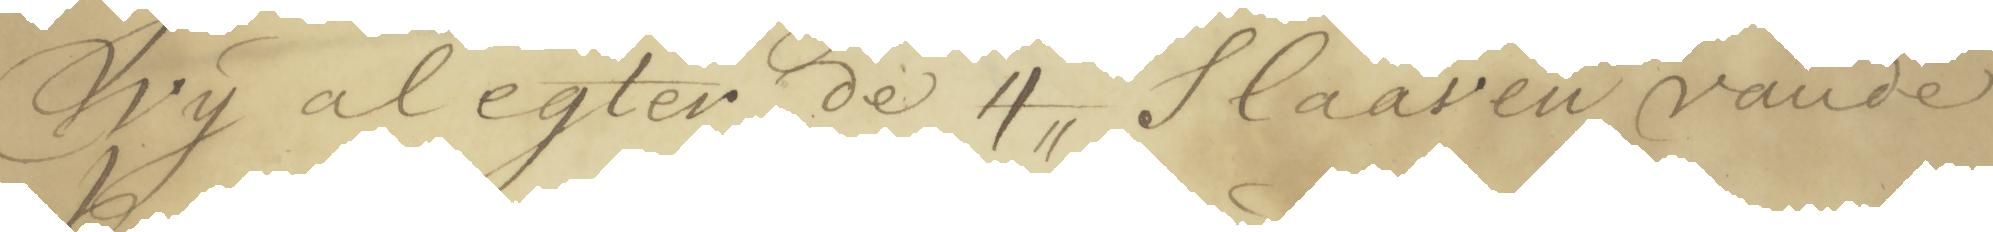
wij al egter de 4„ slaaven vande
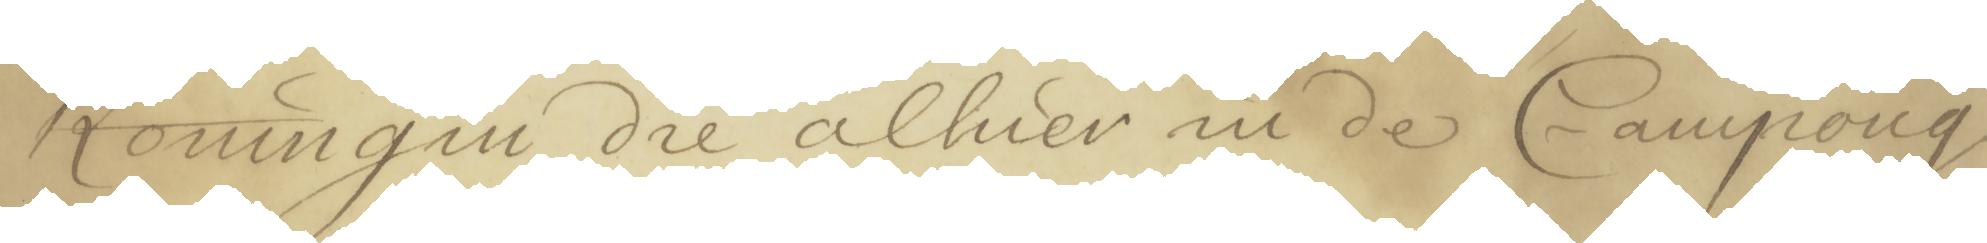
koningin die alhier in de Campong
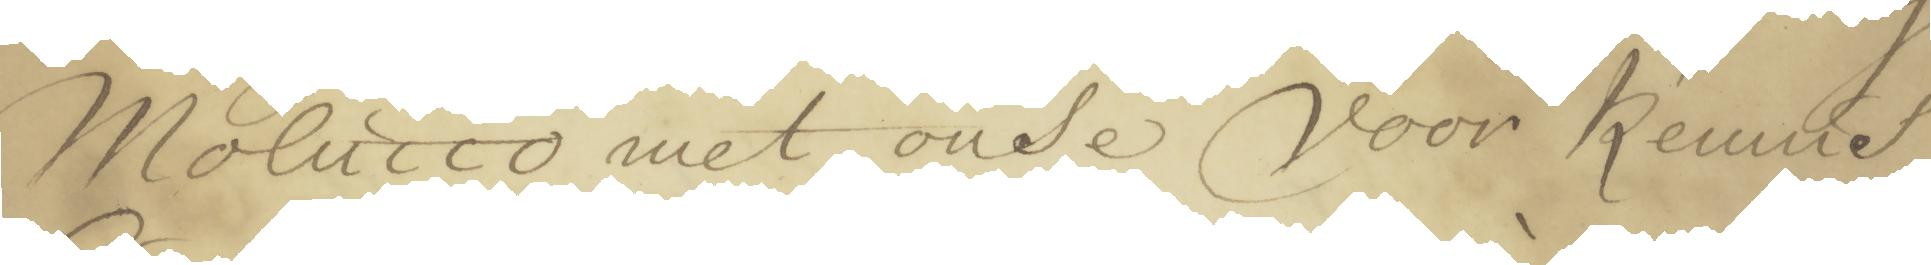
Molucco met onse voor kennis
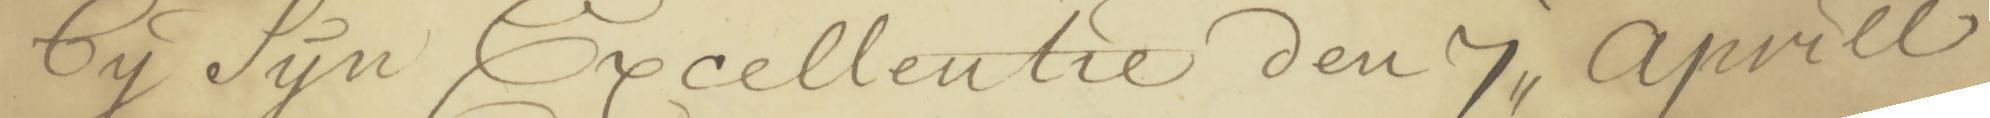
bij sijn Excellentie den 7„' aprill
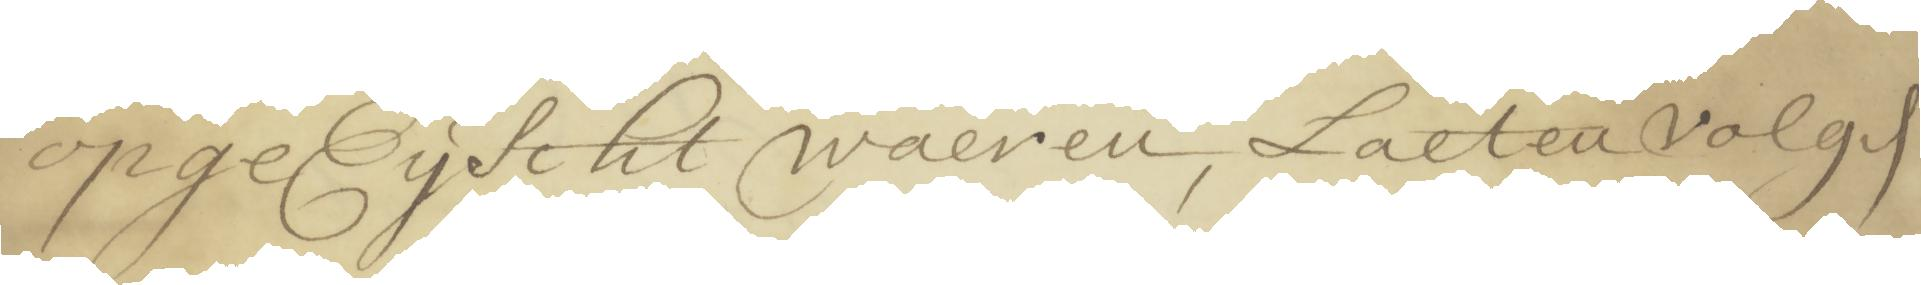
opgeEijscht waeren, laeten volgen
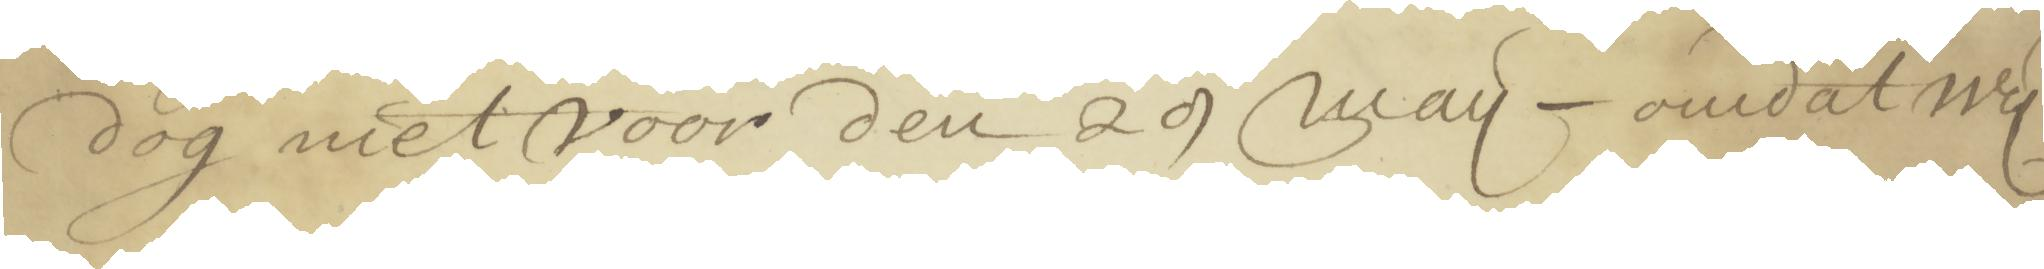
dog niet voor den 28 maij — omdat wij
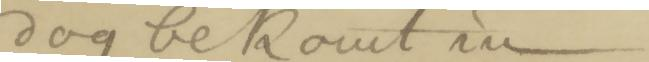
dog bekomt in
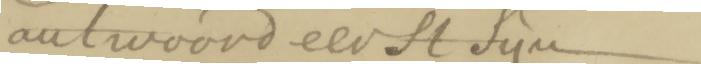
antwoord eerst sijn
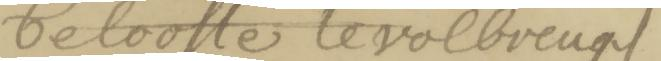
beloofte te volbrengen
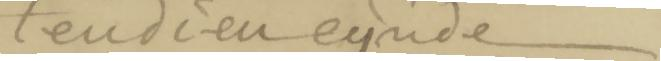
ten dien eijnde
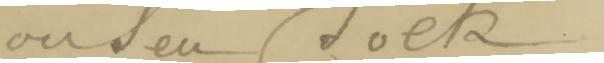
onsen Tolk
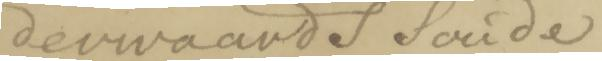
derwaards soude
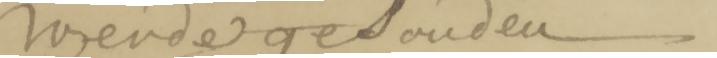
werde gesonden
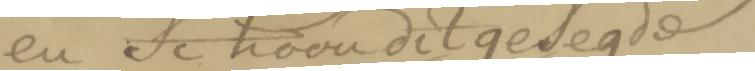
en schoon dit gesegde
